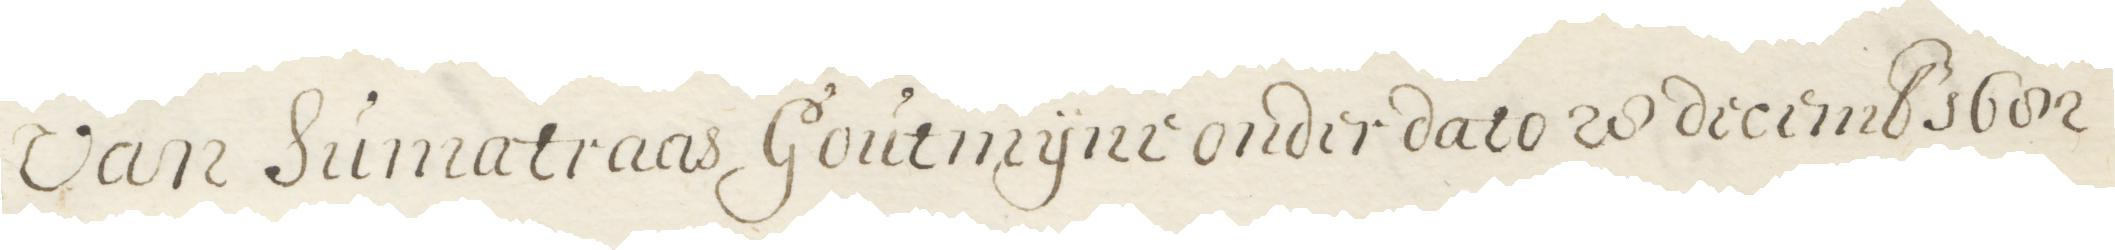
Van Sumatraas Goutmijne onder dato 28 decemb 1682
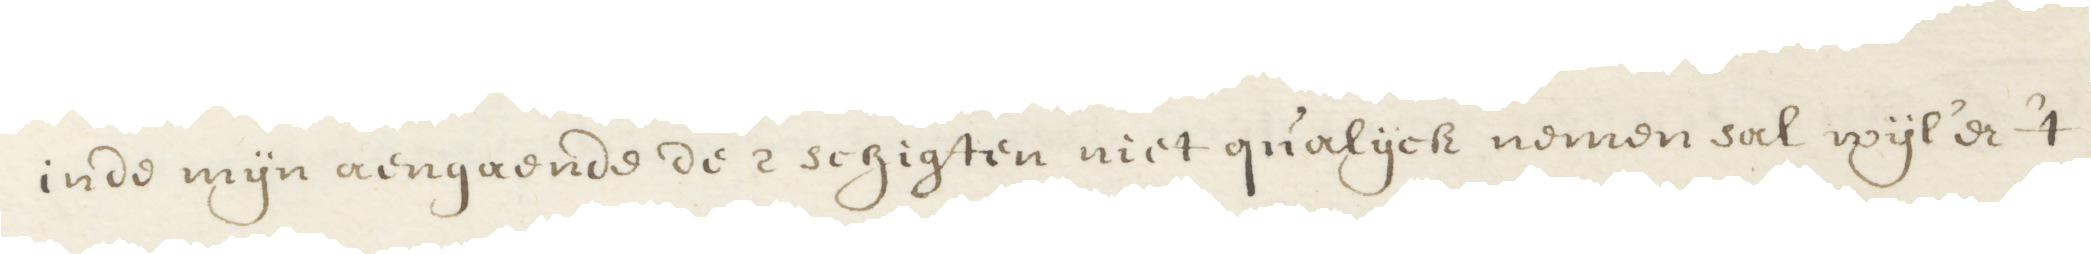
inde mijn aengaende de 2 schigten niet qualijck nemen sal wijl'er ’t
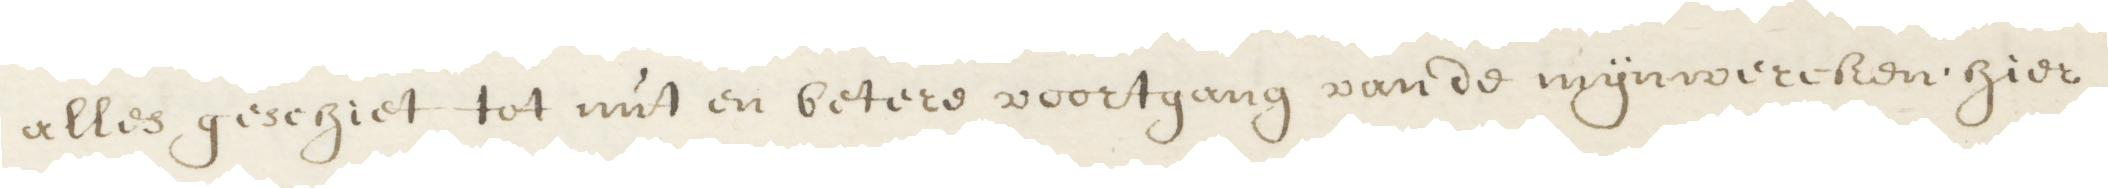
alles geschiet tot nut en betere voortgang van de mijnwercken hier
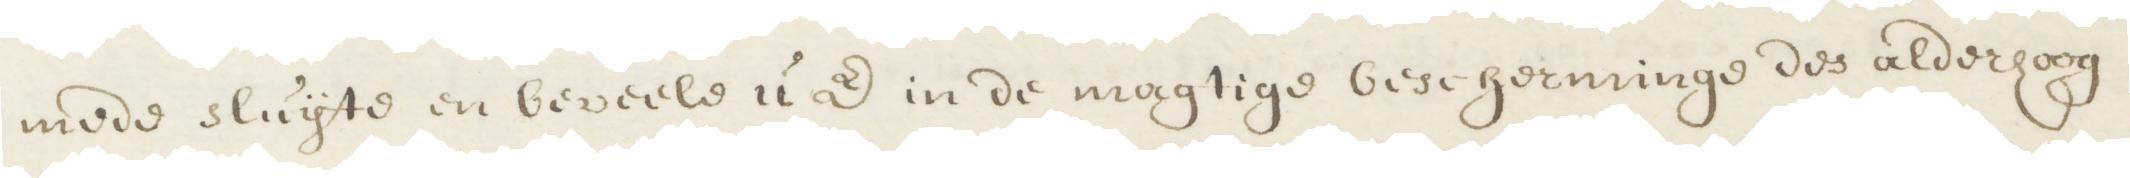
mede sluijte en beveele u E in de magtige bescherminge des alderhoog
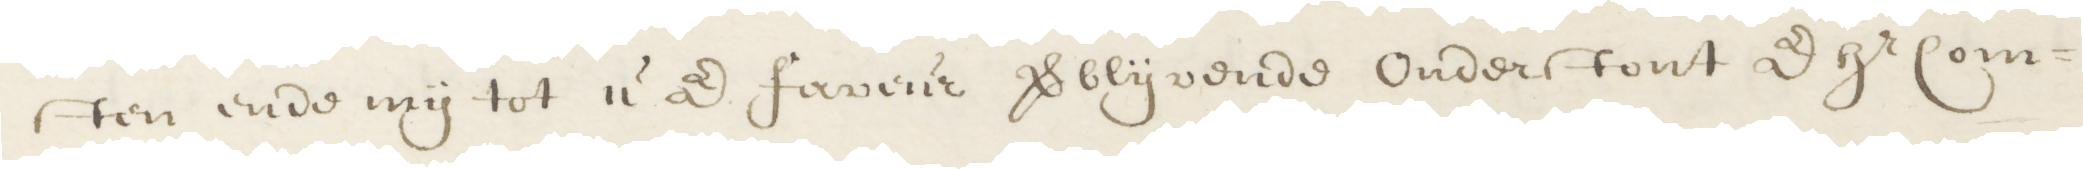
sten ende mij tot u E faveur verblijvende onderstont E hr Com=
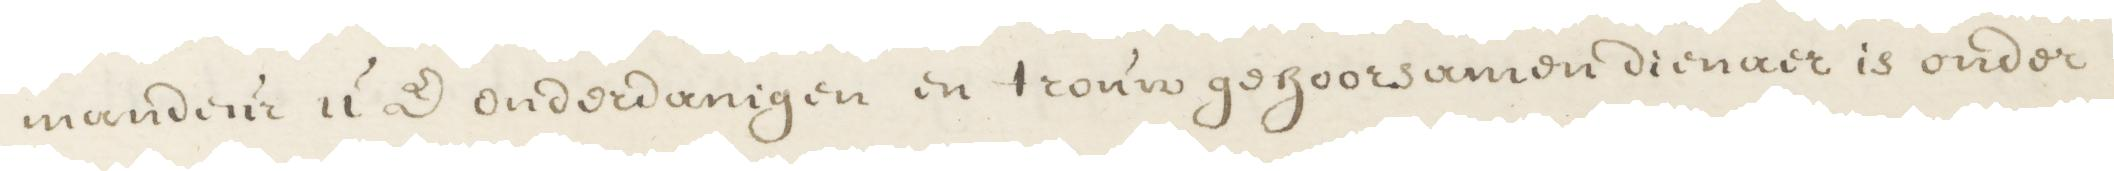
mandeur u E onderdanigen en trouw gehoorsamen dienaer is onder
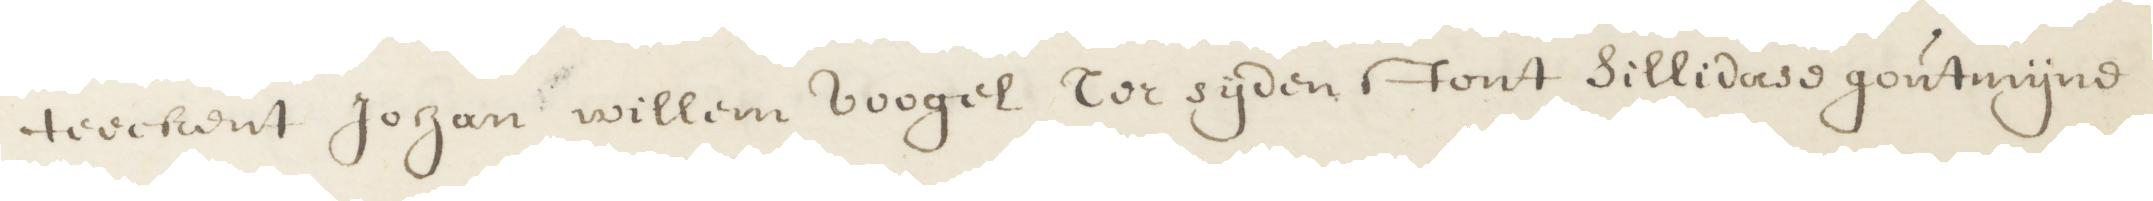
teeckent Johan willem voogel ter sijden stont sillidase goutmijne
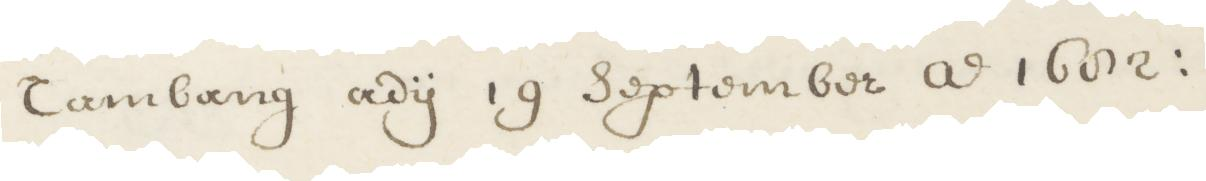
tambang adij 19 september ao 1682:
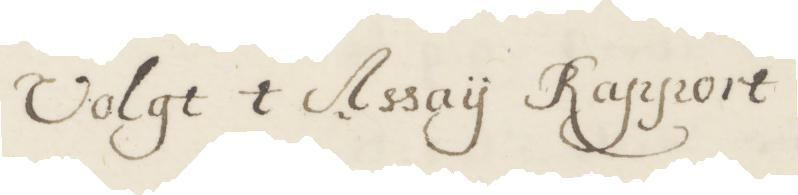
Volgt t Assaij Rapport
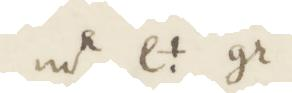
mk l:t gr
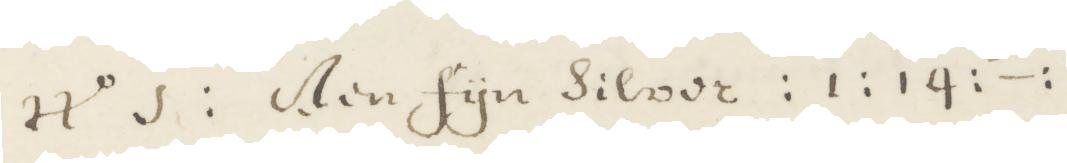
No 1: Aen fijn silver : 1 : 14 :—:
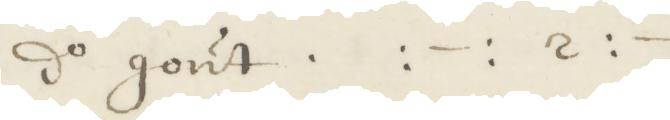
do gout . : — : 2 :—
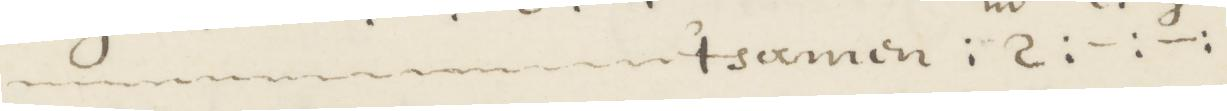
't samen : 2 : — : — :
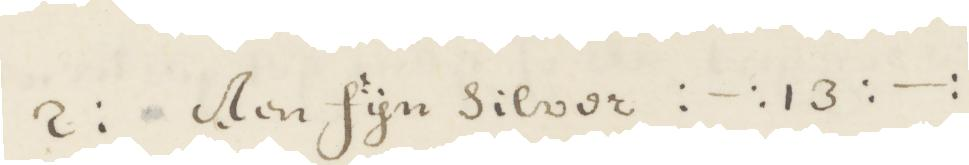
2: Aen fijn silver : — : 13 :—
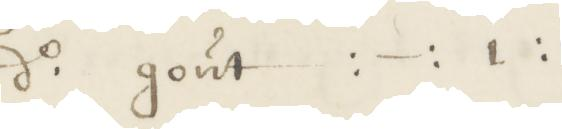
d:o gout : —:1:—:
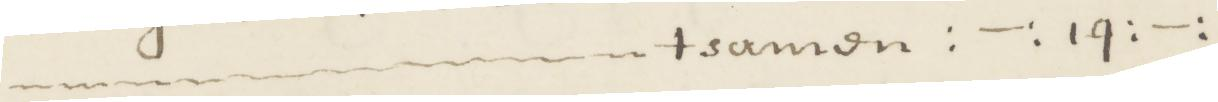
t samen:—:19:—:
